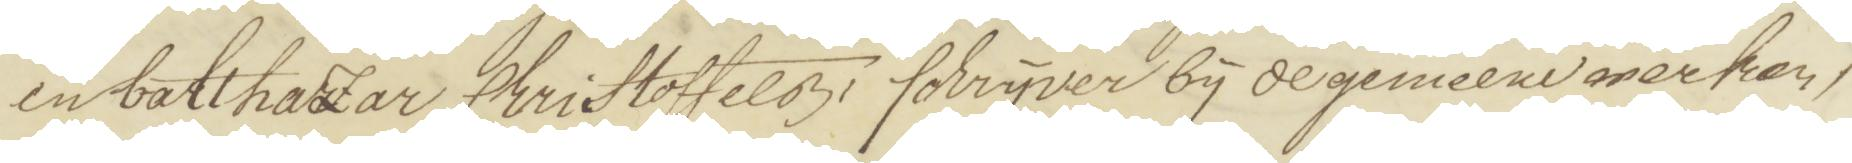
en balthazar Christoffels: schrijver bij de gemeene werken,
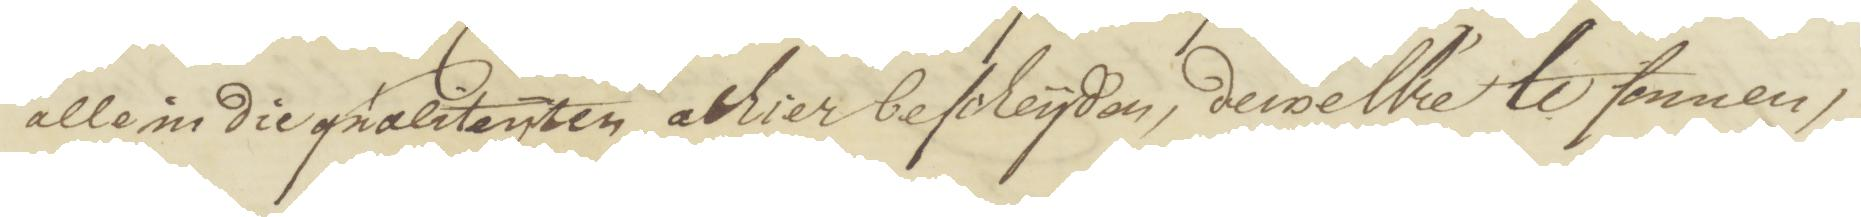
alle in die qualiteijten alhier bescheijden, dewelke te samen,
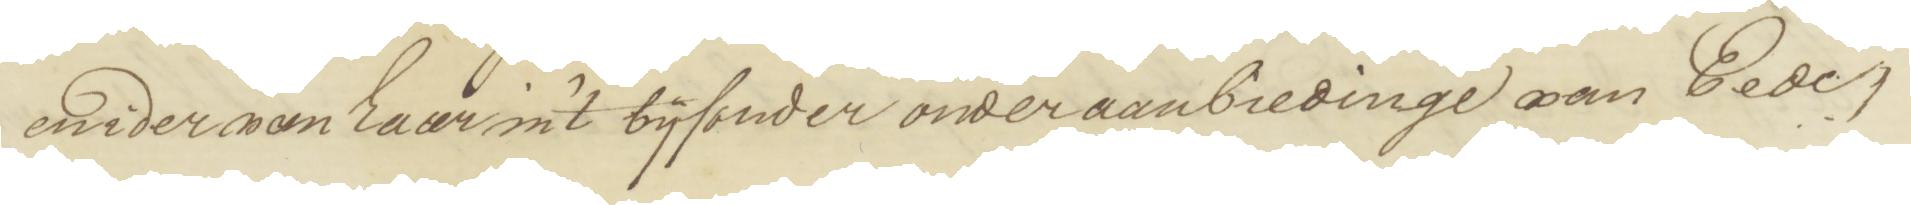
en ider van haar in’t bijsonder onder aanbiedinge van Eede,
